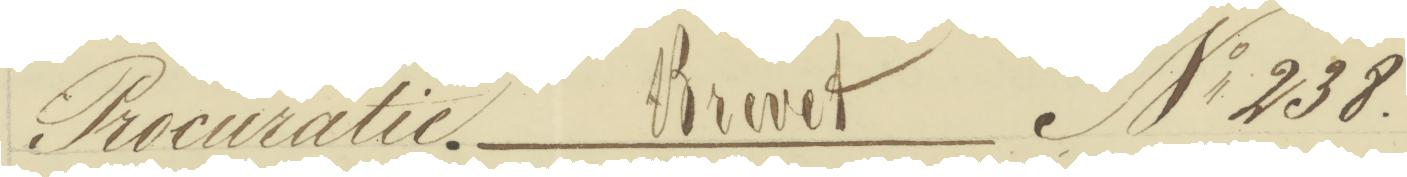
Procuratie Brevet N„o 238.
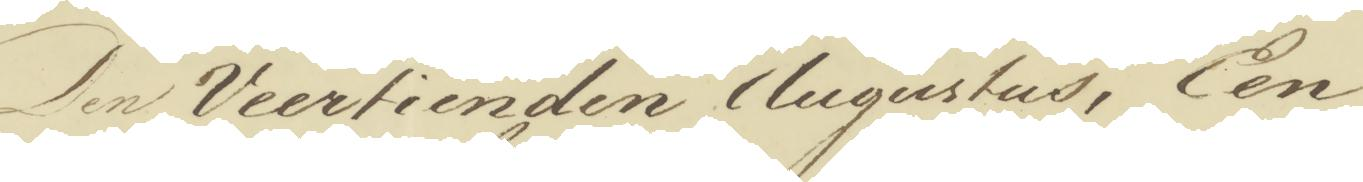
Den Veertienden Augustus, Een
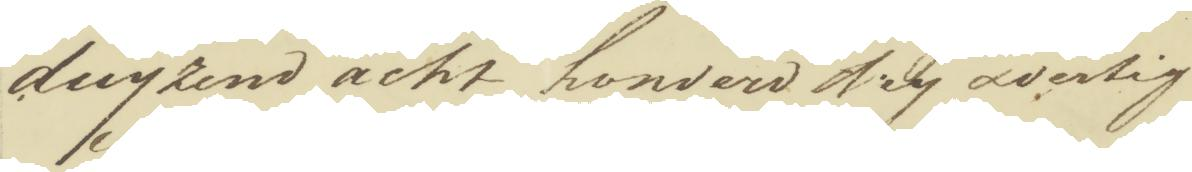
duyzend acht honderd dry & dertig
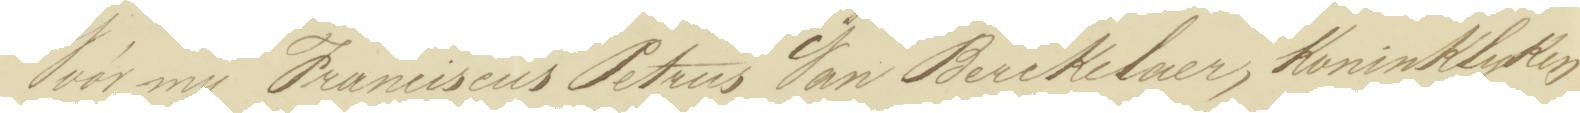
Voor my Franciscus Petrus Van Berckelaer, Koninklyken
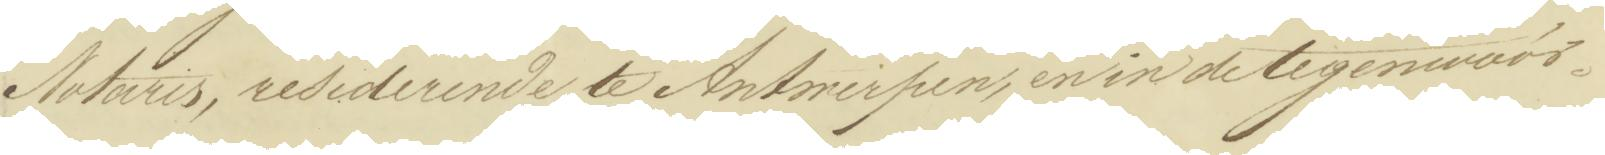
Notaris, residerende te Antwerpen, en in de tegenwoor=
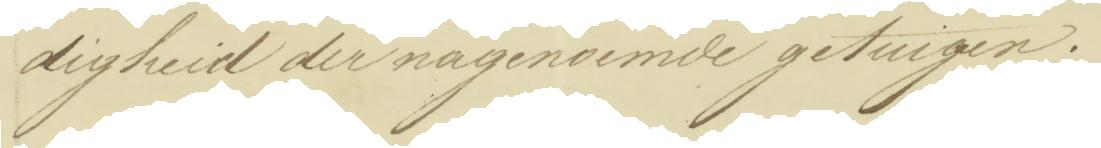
digheid der nagenoemde getuigen.
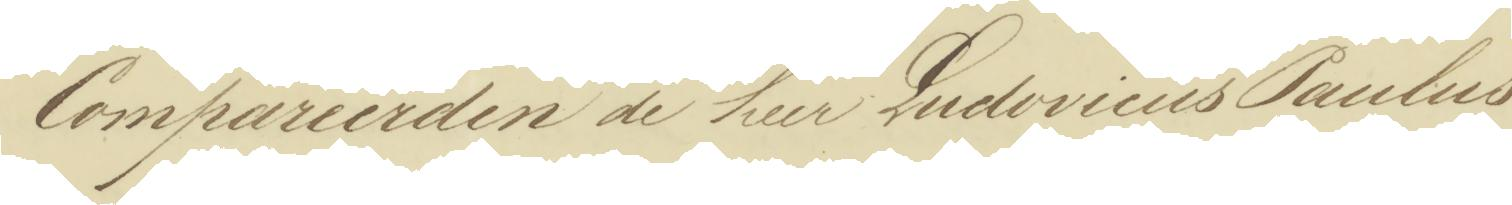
Compareerden de heer Ludovicus Paulus
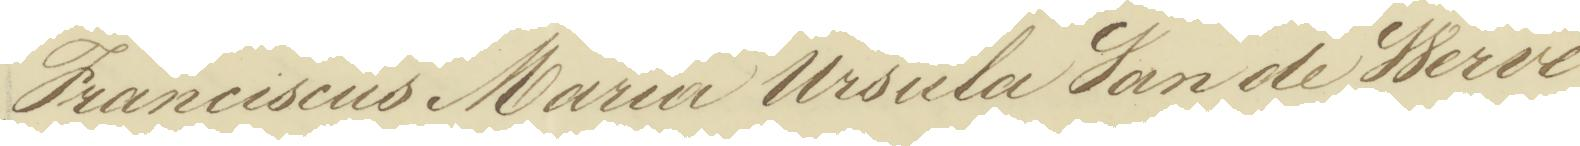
Franciscus Maria Ursula Van de Werve
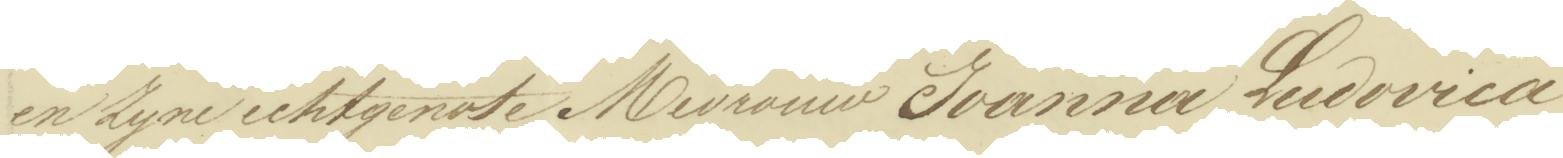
en zyne echtgenote Mevrouw Ioanna Ludovica
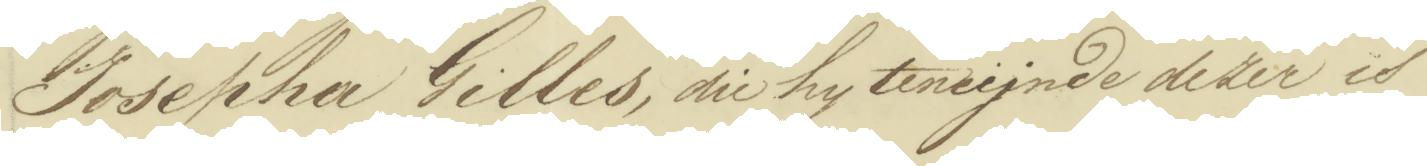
Josepha Gilles, die hy teneijnde dezer is
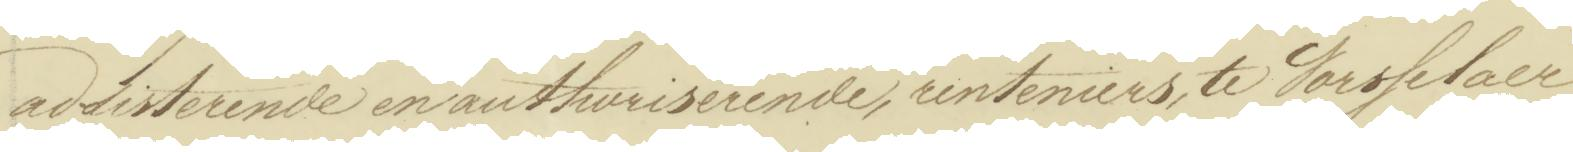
adisterende en authoriserende, renteniers, te Vorsselaer
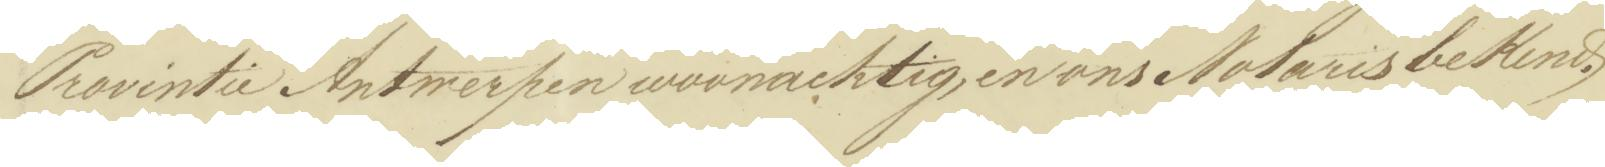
Provintie Antwerpen woonachtig, en ons Notaris bekend
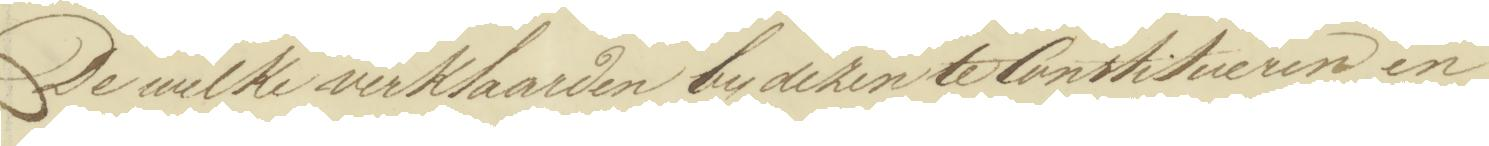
De welke verklaarden by dezen te constitueren en
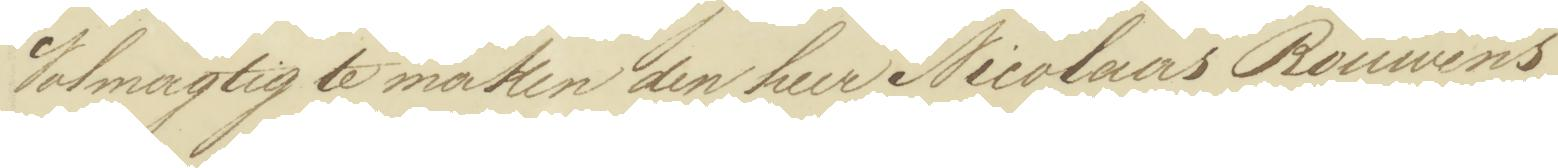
Volmagtig te maken den heer Nicolaas Rouwens
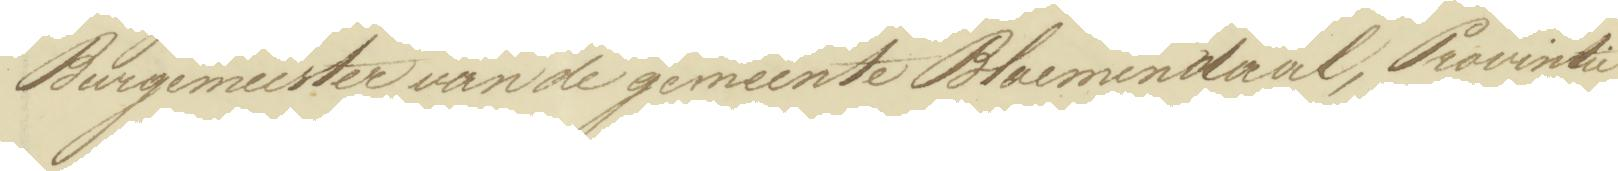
Burgemeester van de gemeente Blaemendaal, Provintie
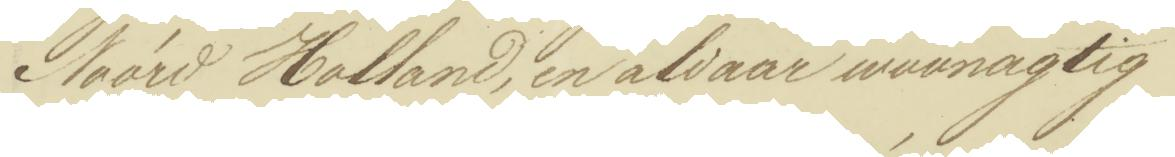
Noord Holland, en aldaar woonagtig
